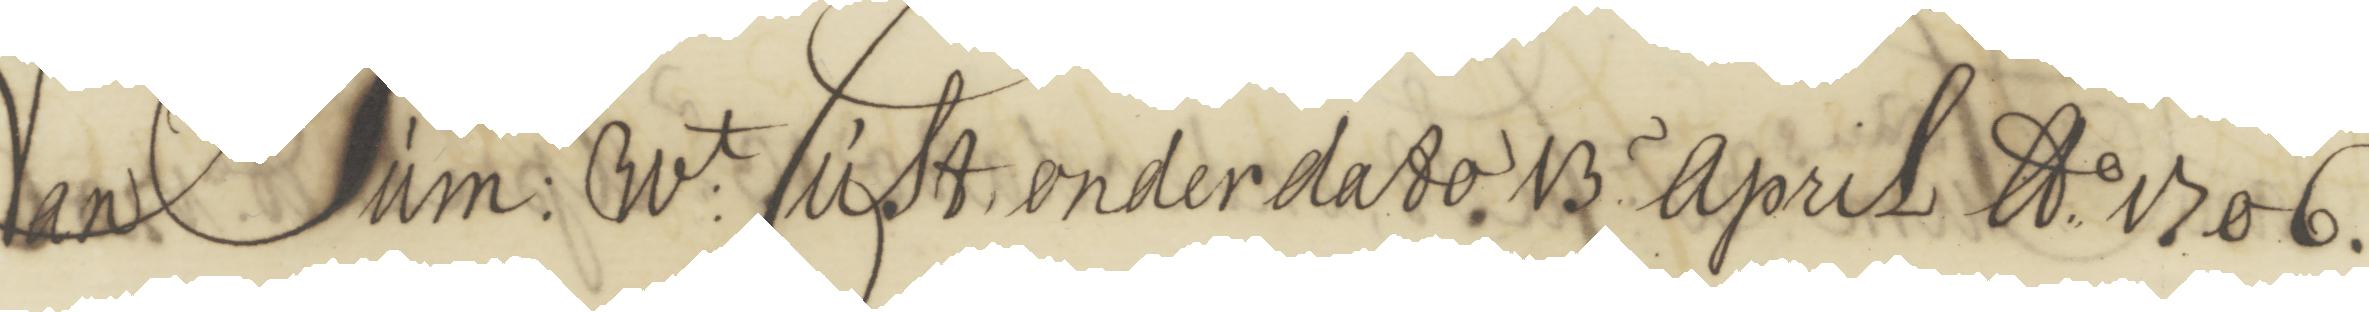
Van Sum:tras w:t Cust onder dato 13:e April A.o 1706.
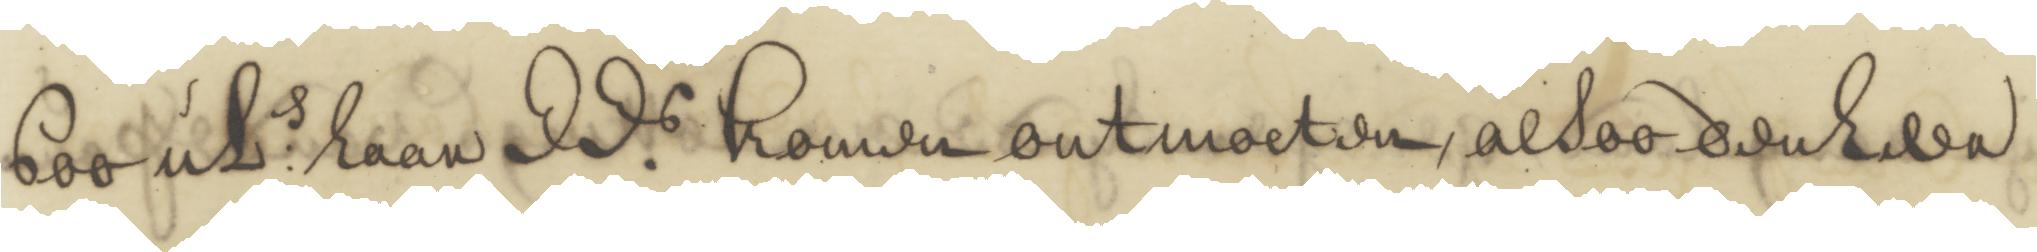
soo uL:en haar EE.s komen ontmoeten, alsoo den heer
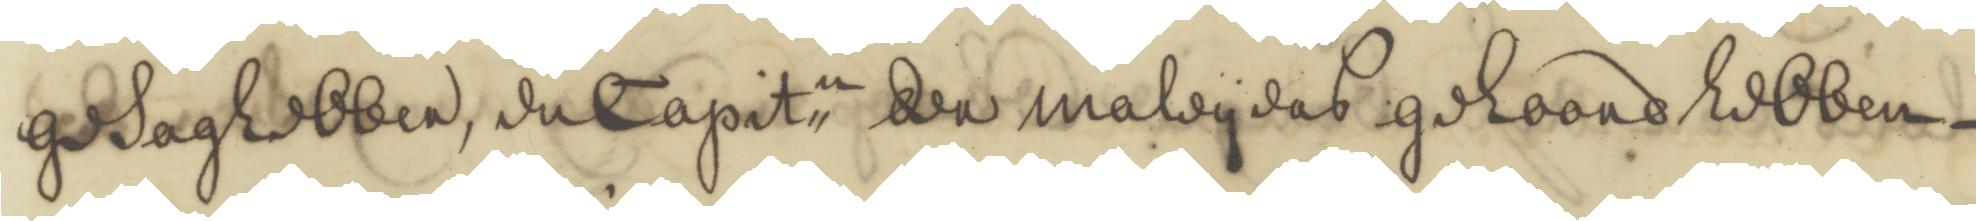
gesaghebber, en capit„n der maleijdas gehoord hebben
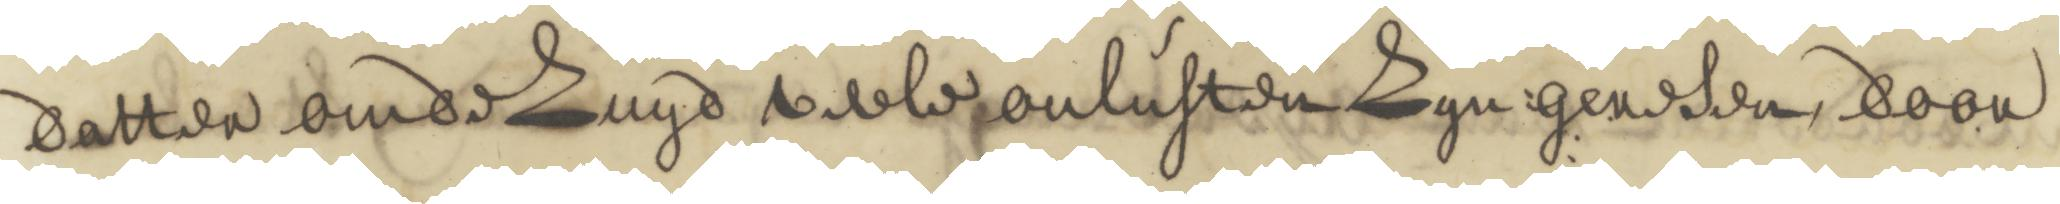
datter omde zuyd veele onlusten zijn geresen, door
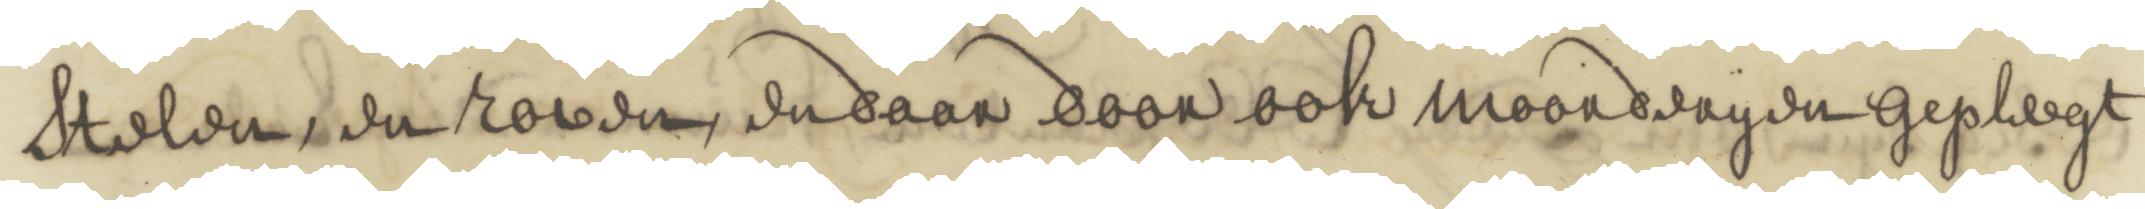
stelen, en roven, en daar door ook moorderijen gepleegt
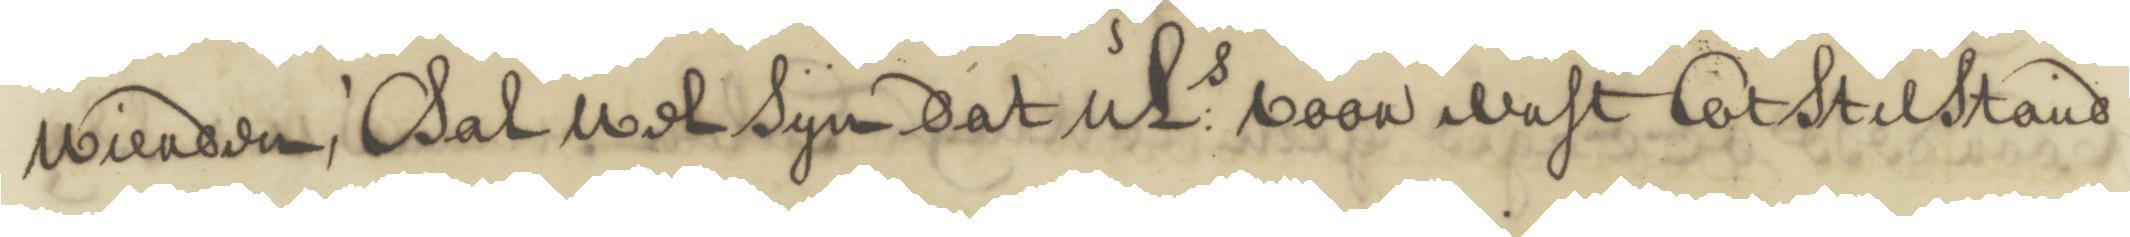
wierden; ’t sal wel sijn dat uL:en voor eerst tot stilstand
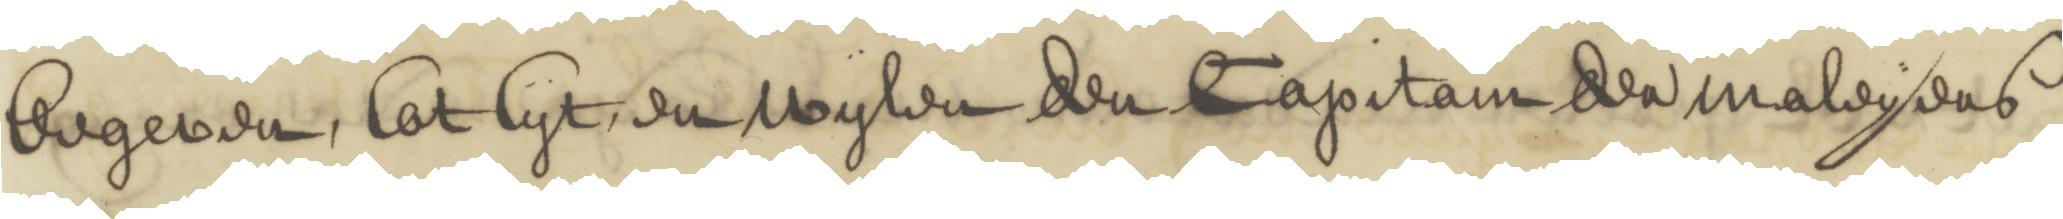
begeven, tot tijt en wijlen den capitain der maleijers
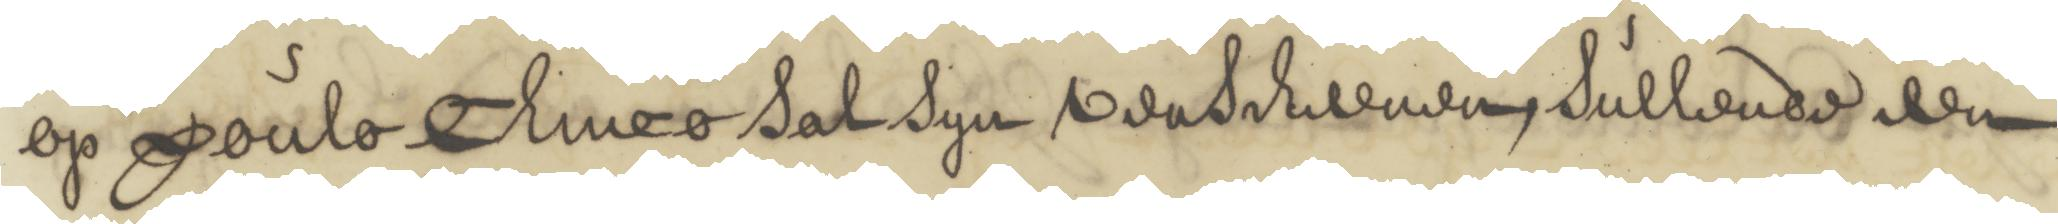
op poulo Chinco sal sijn verscheenen, sullende een
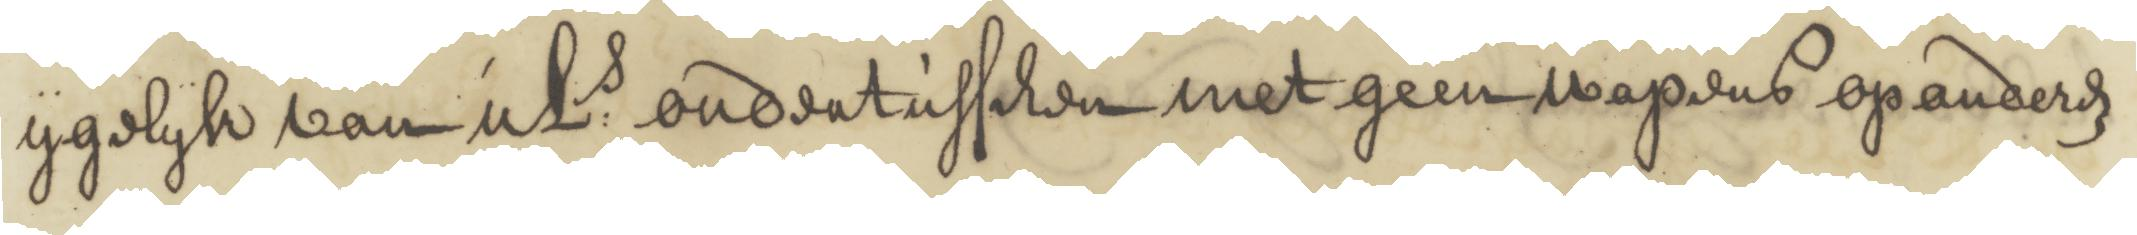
ijgelijk aan u L:en ondertusschen met geen wapens op anderen
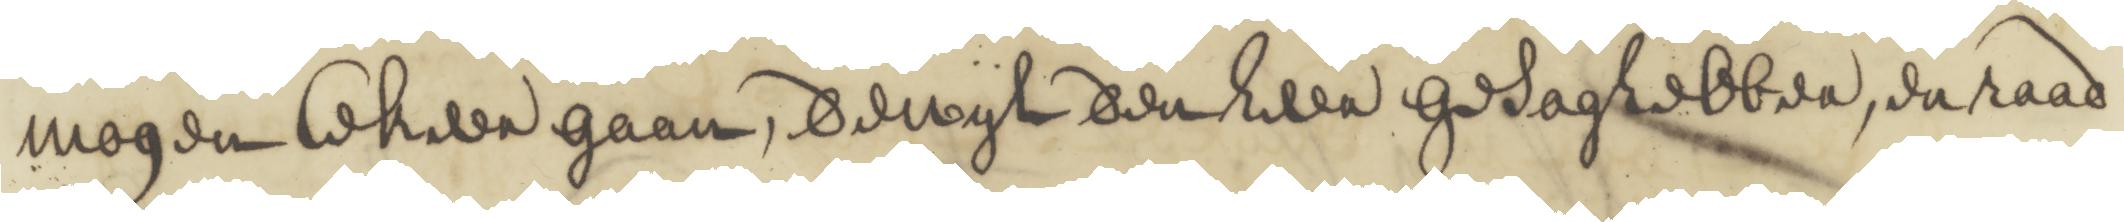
mogen tekeer gaan, dewijl den heer gesaghebber, en raad
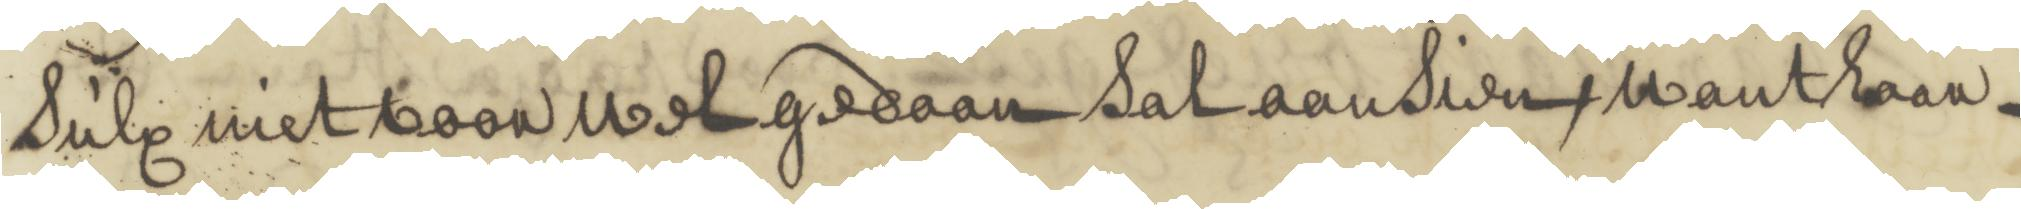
sulx niet voor wel gedaan sal aansien, want haar
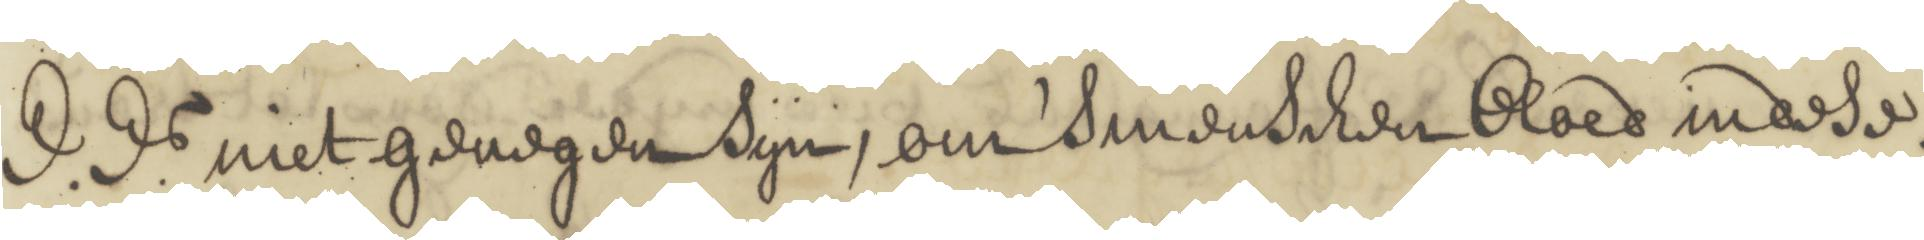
E. E.en niet genegen sijn, om ’s menschen bloed indese
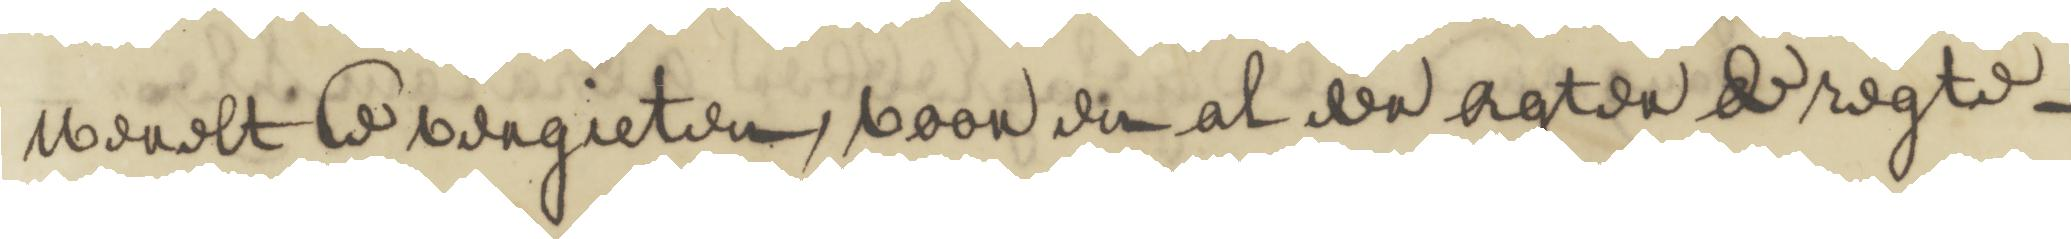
werelt te vergieten, voor en al der agter de regte
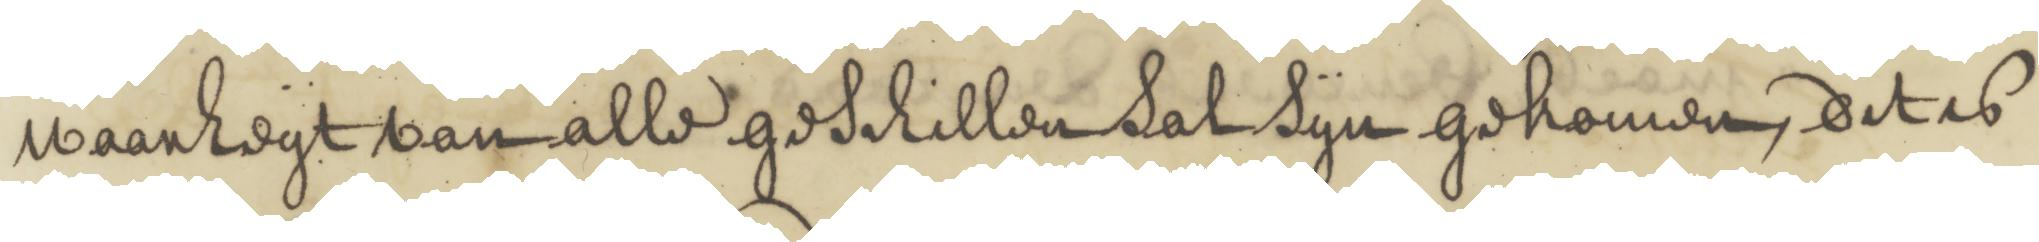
waarheijt van alle geschillen sal sijn gekomen, dit is
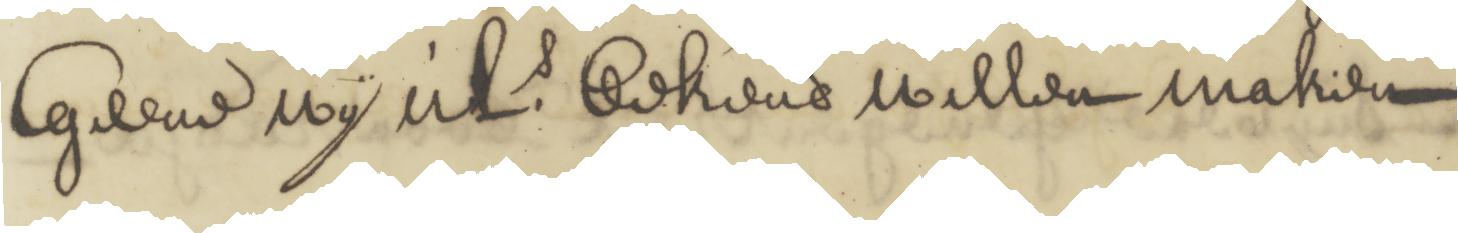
tgeene wij uL:en bekend willen maken
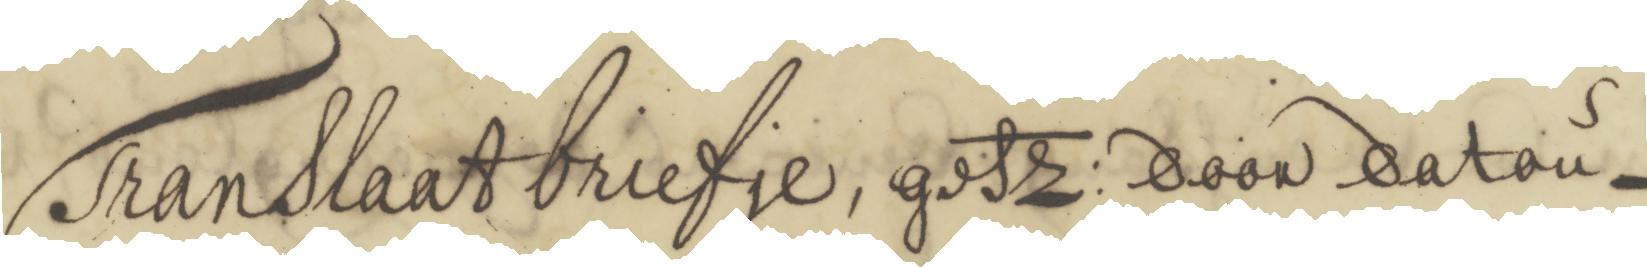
Translaat briefje, gesz: door datou
